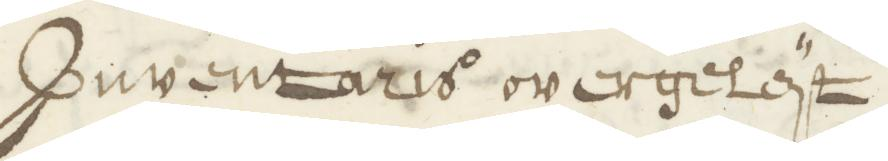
Jnventaris overgeleijt
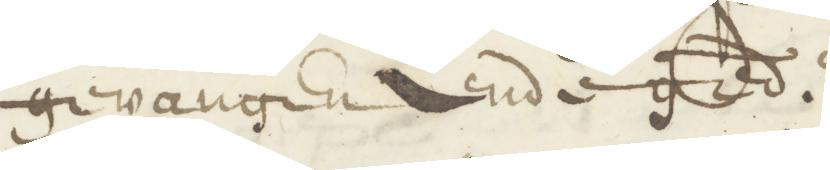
gevangen ende ged.e
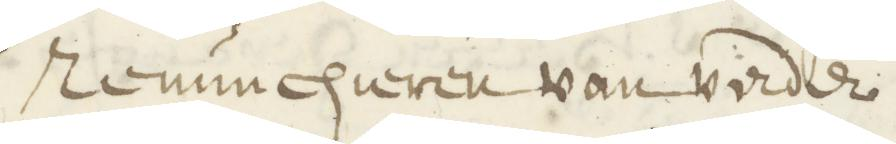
Renunchieren van verder
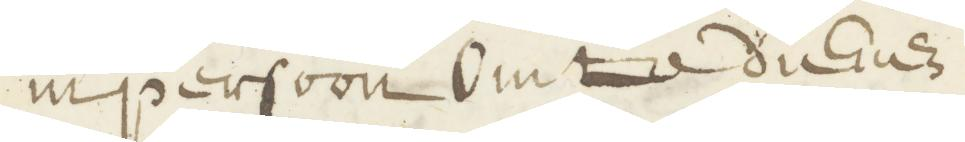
in persoon Om te dienen
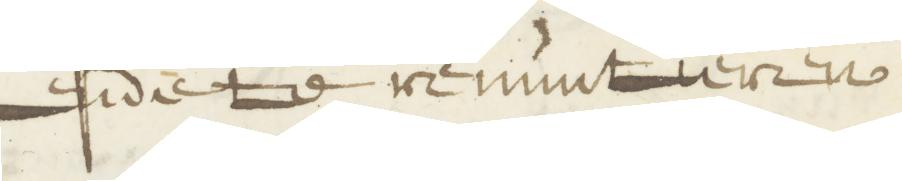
Ende te renuntieren
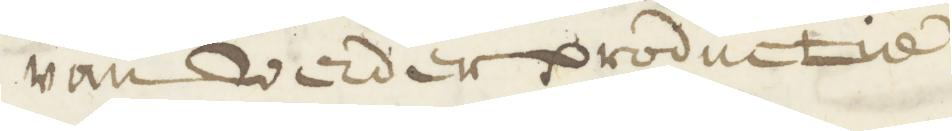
van verder productie
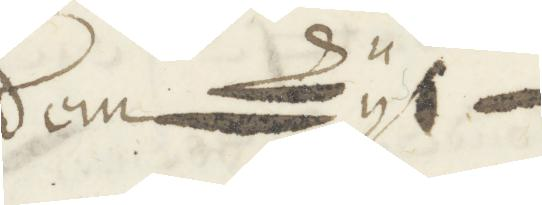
Jdem Eijs—rs
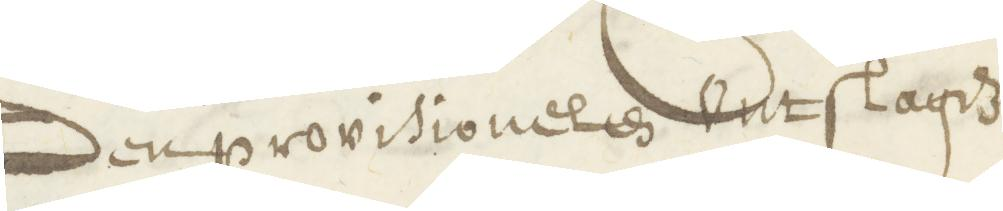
Den provisionelen Ontslagen
